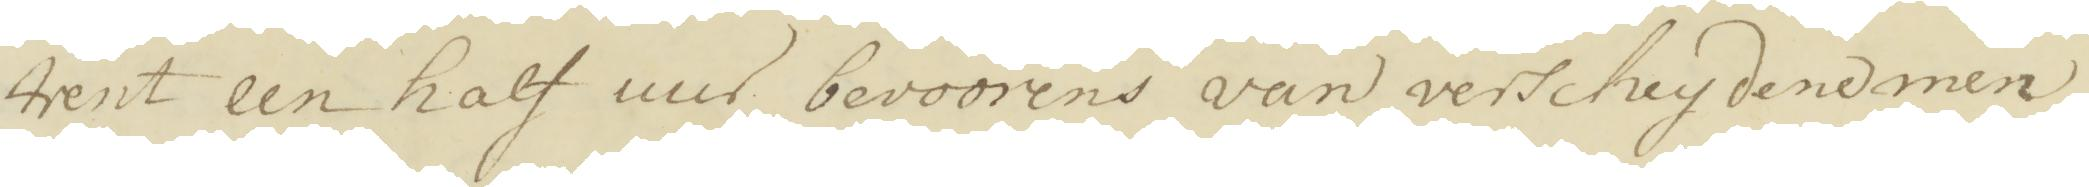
trent een half uur bevoorens van verscheydene men
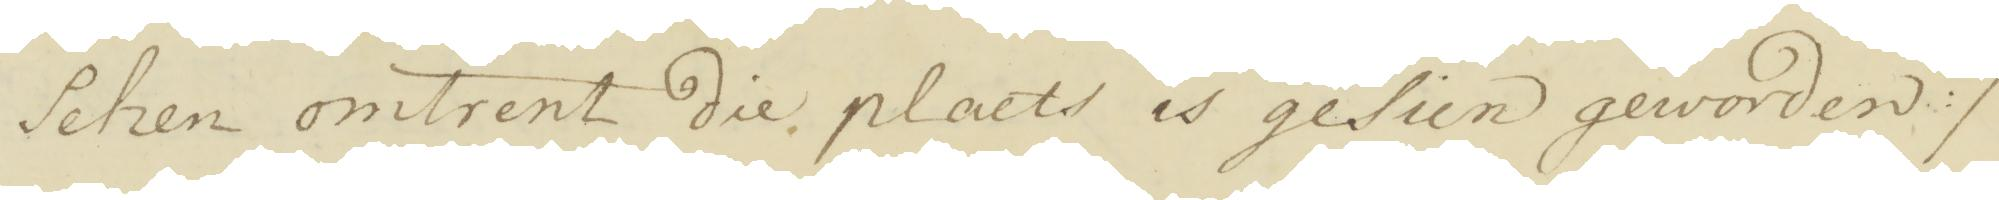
schen omtrent die plaets is gesien geworden:/
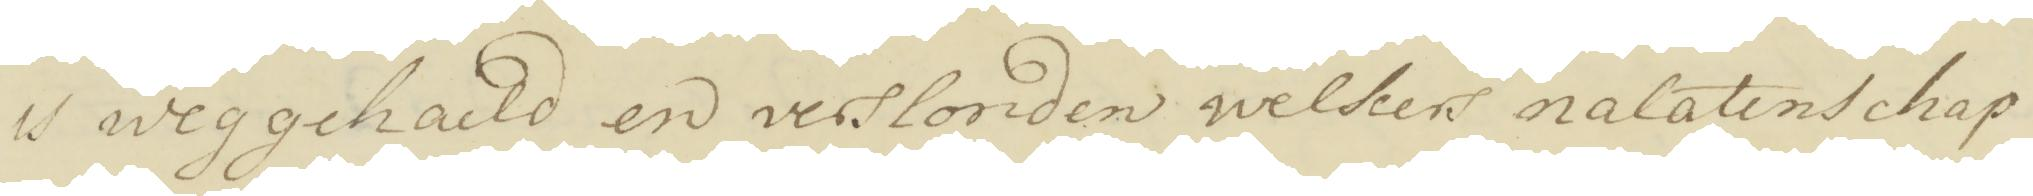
is weggehaeld en veslonden welkers nalatenschap
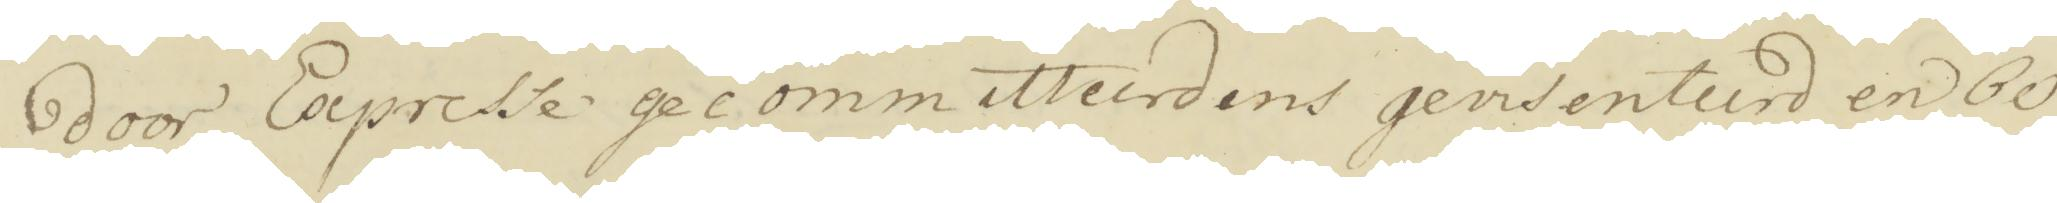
door Expresse gecommitteerdens gevisenteerd en be
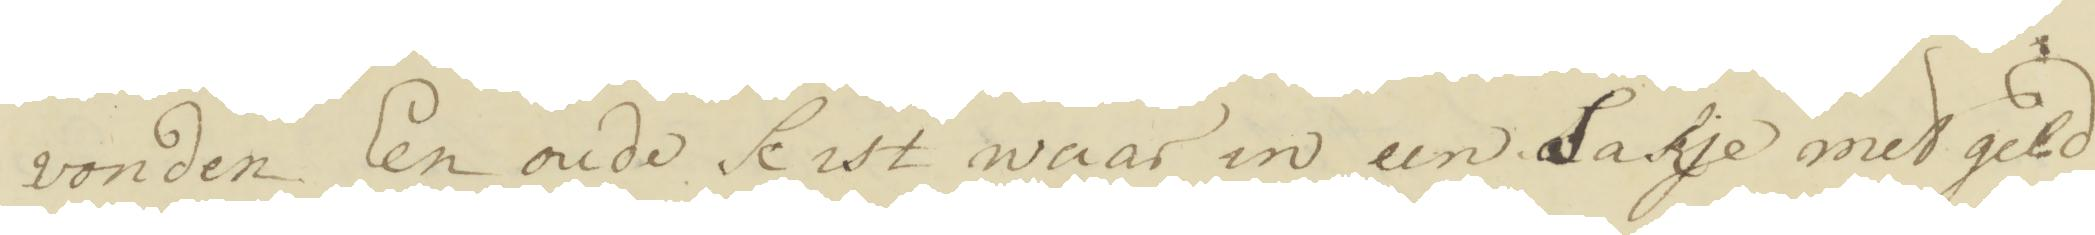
vonden Een oude kist waar in een sakje met geld
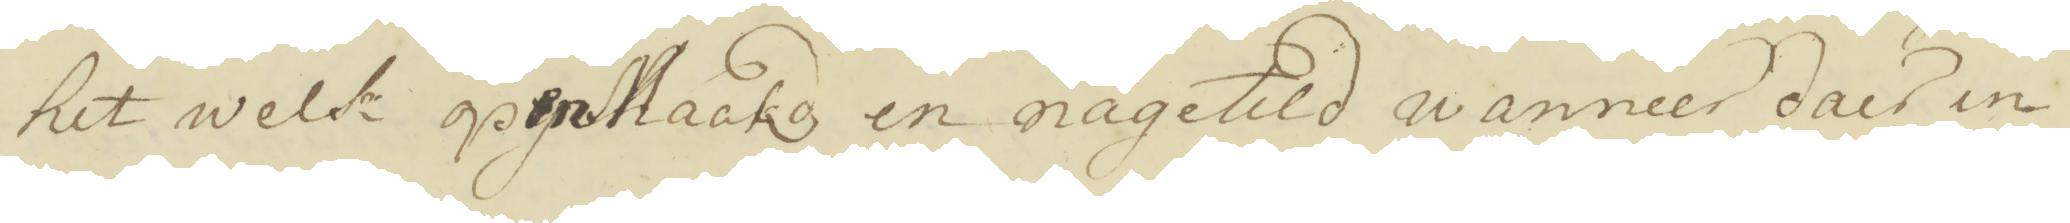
het welk openmaakd en nageteld wanneer daer in
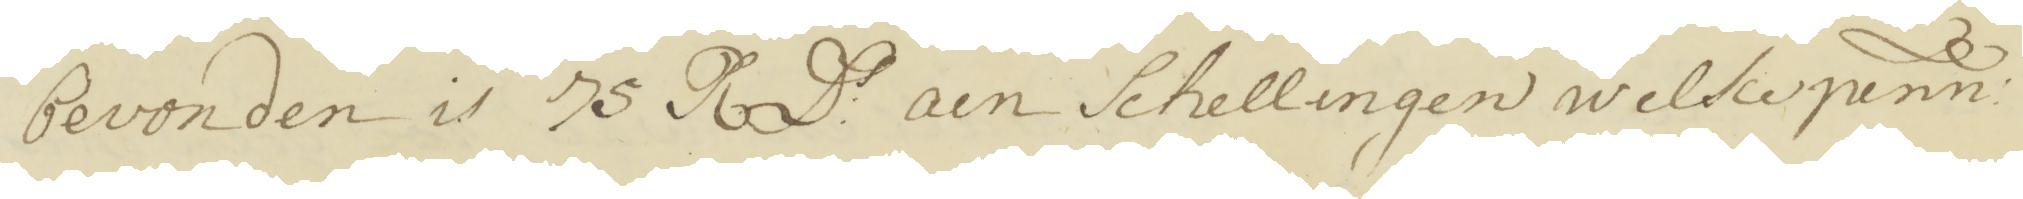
bevonden is 75 R D:s aen schellingen welke penn:
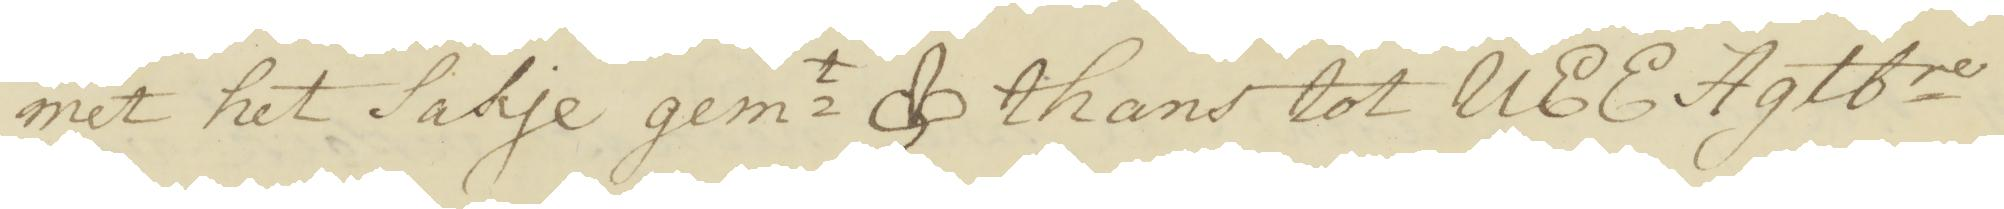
met het sakje gem=t cb thans tot UEE Agtb=re
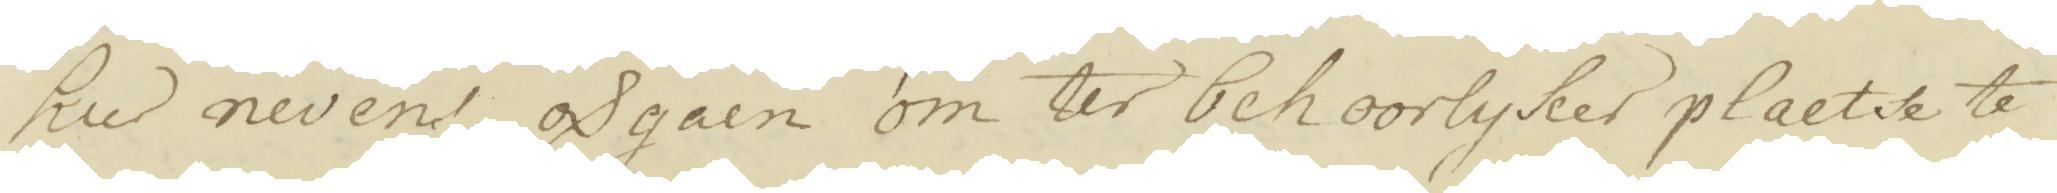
hier nevens overgaen om ter behoorlyker plaetse te
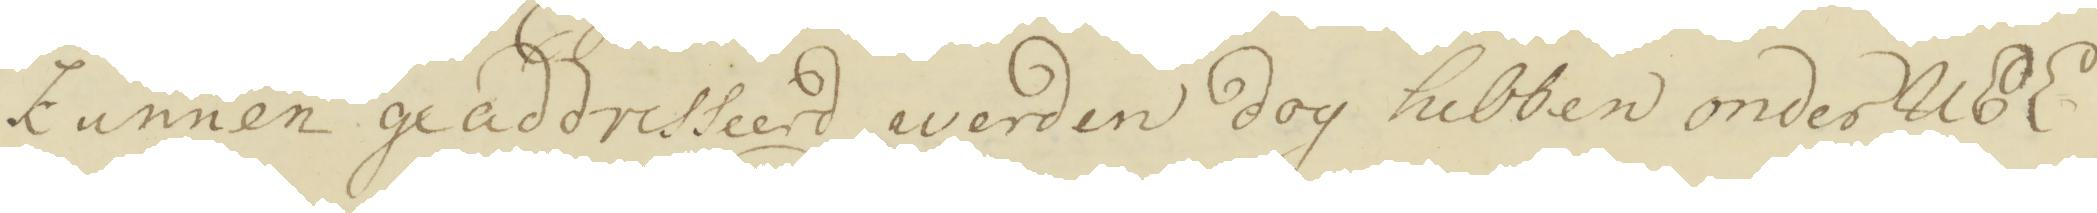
kunnen geaddresseerd werden dog hebben onder UEE
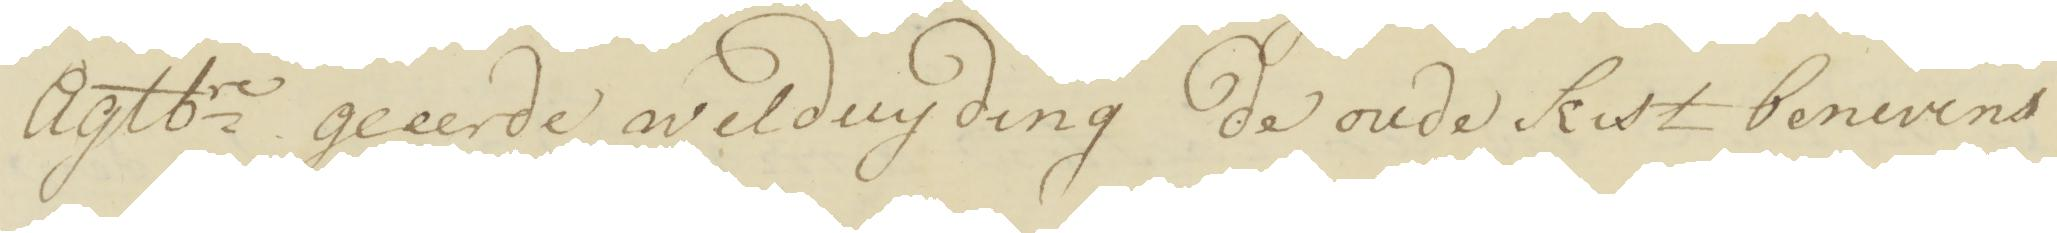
Agtb=re geeerde welduyding de oude kist benevens
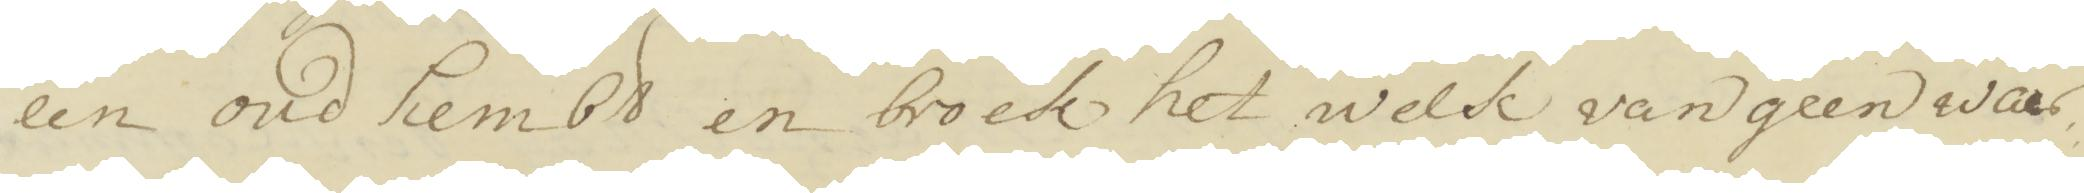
een oud hembt en broek het welk van geen waer„
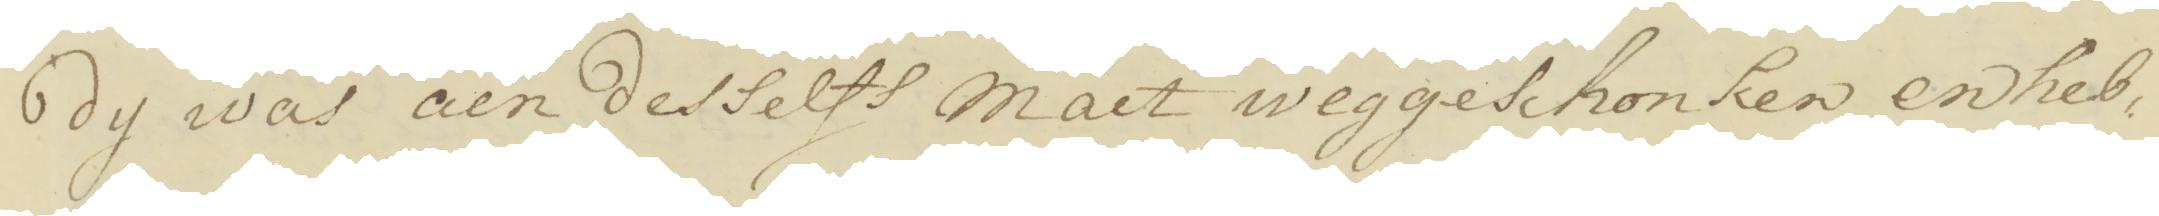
dy was aen desselfs maet weggeschonken en heb„
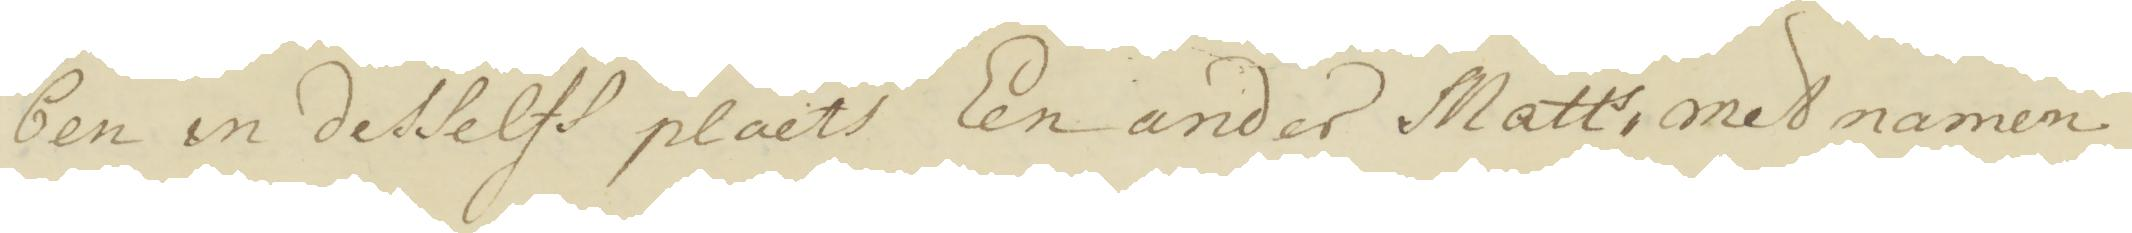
ben in desselfs plaets Een ander Matt„s met namen
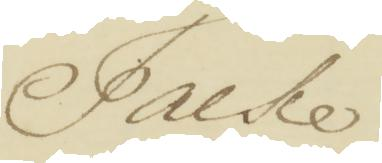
Faeke
